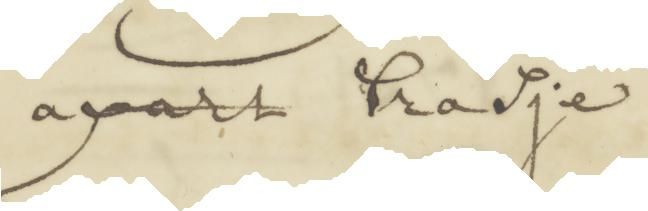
apart kasje
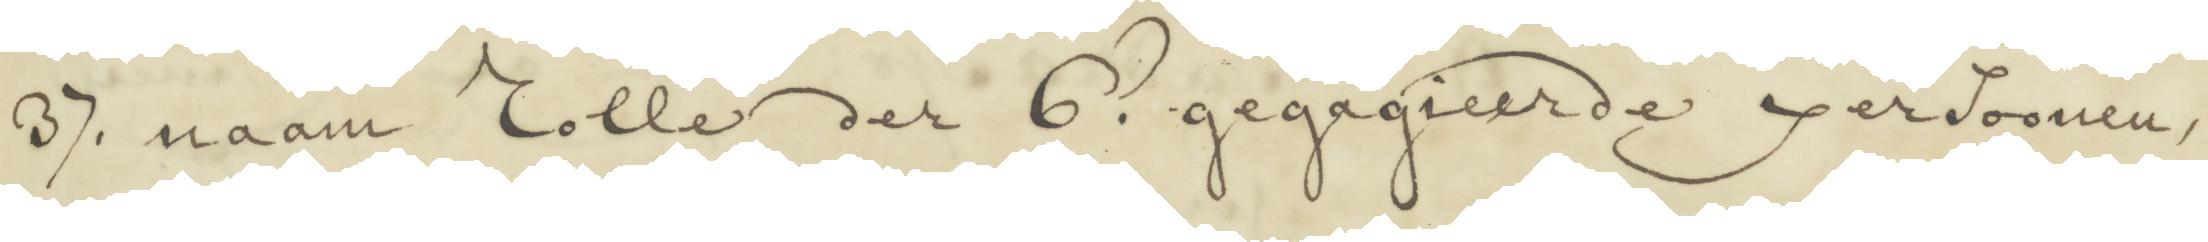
37. naam Rolle der 6:' gegagieerde persoonen,
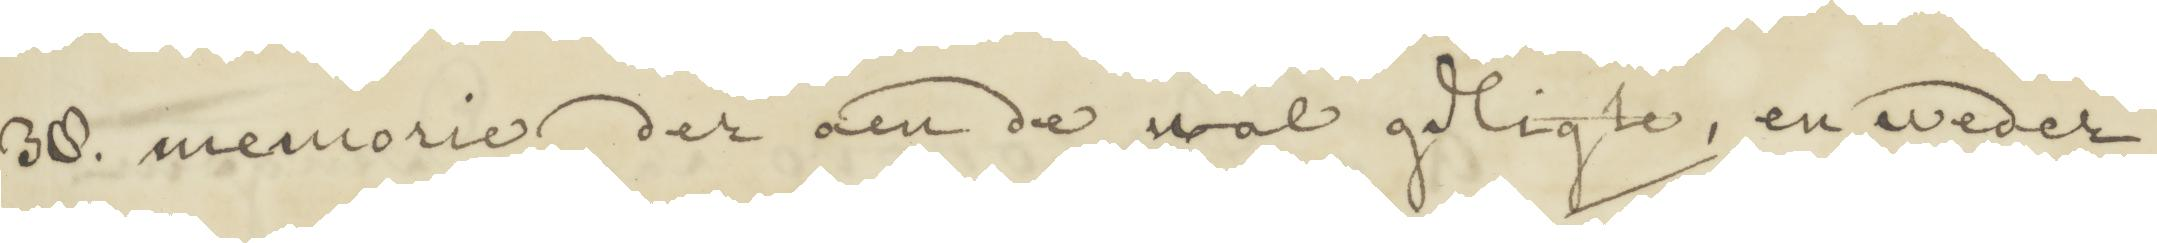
38. memorie der aen de wal geligte, en weder
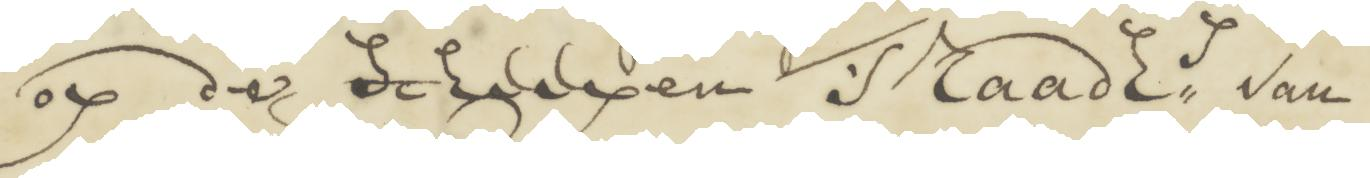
op de scheepen 's Raadh„s van
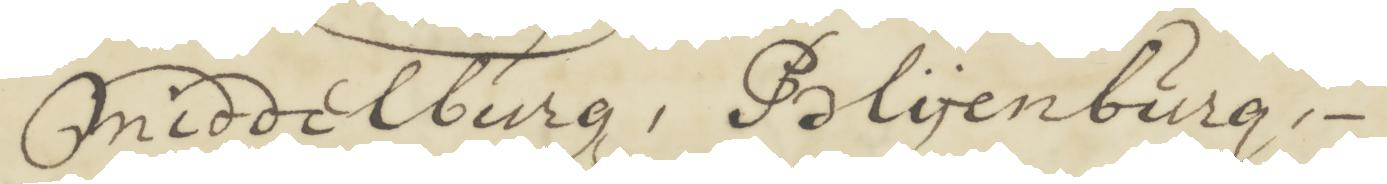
Middelburg, Blijenburg, —
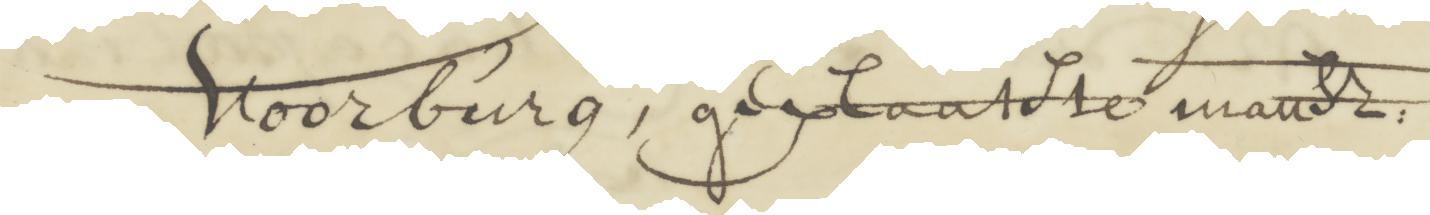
en Voorburg, geplaatste mansz:
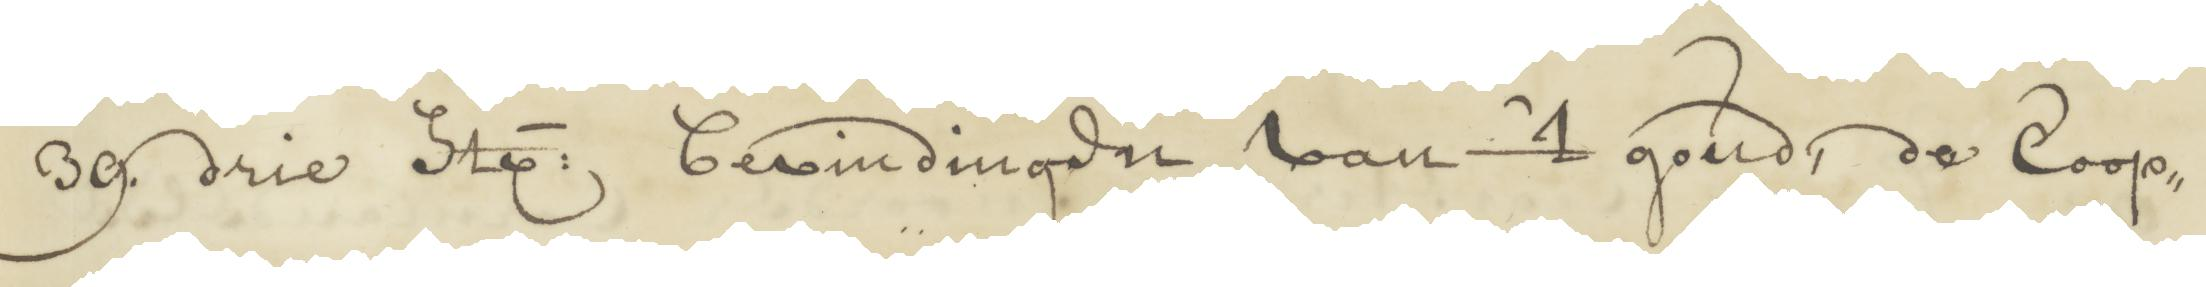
39. drie stx: bevindingen van ’t goud, de Coop„
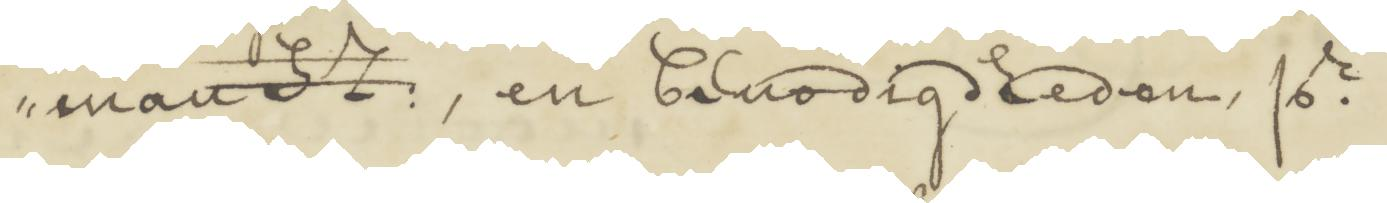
„mansz:, en benodigdheden, p.r
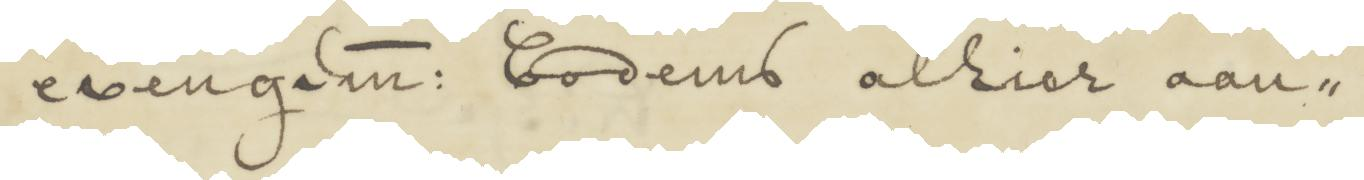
evengem: bodems alhier aan„
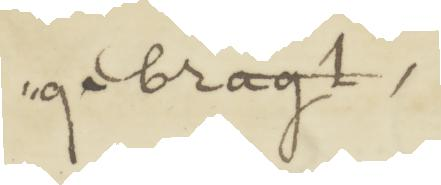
„gebragt,
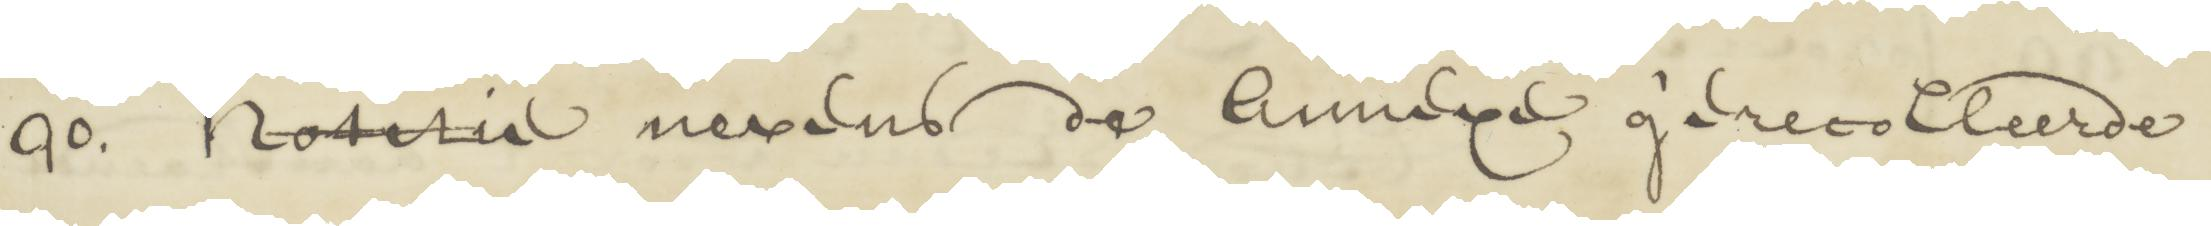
40. Notitie nevens de Annexe g’erecolleerde
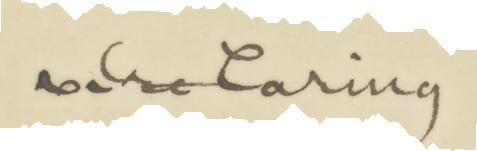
verclaring
